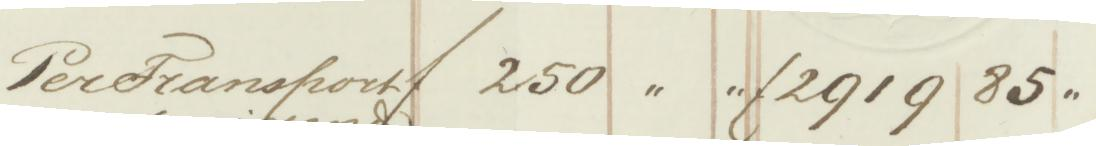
Per Transport ƒ 250 „ƒ2919 85 „
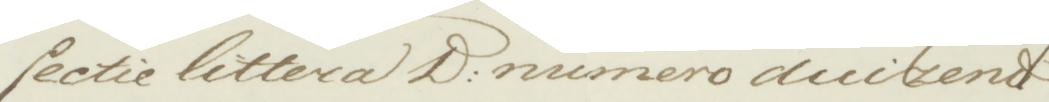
sectie littera D: numero duizend
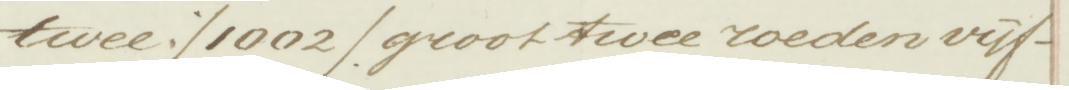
twee :/1002/ groot twee roeden vijf=
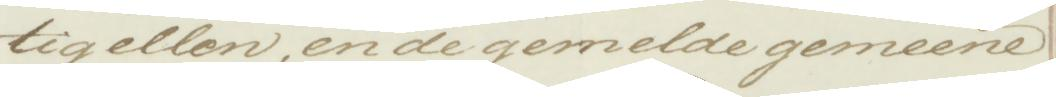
tig ellen, en de gemelde gemeene
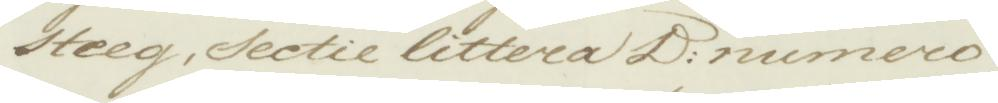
steeg, sectie littera D: numero
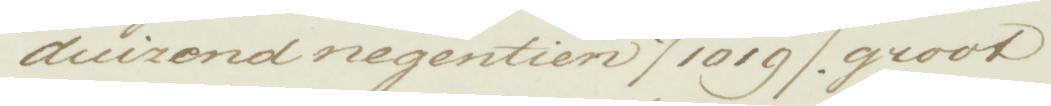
duizend negentien '/1019/. groot
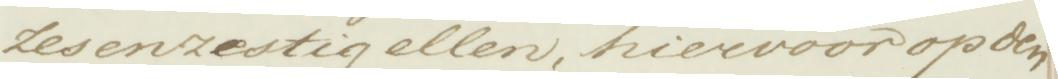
zes en zestig ellen, hiervoor op den
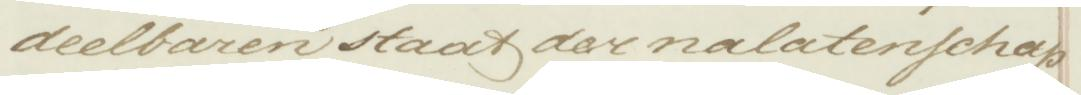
deelbaren staat der nalatenschap
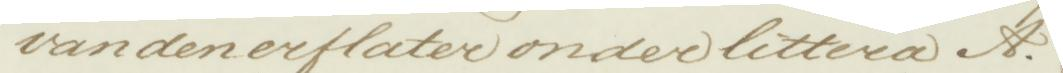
van den erflater onder littera A.
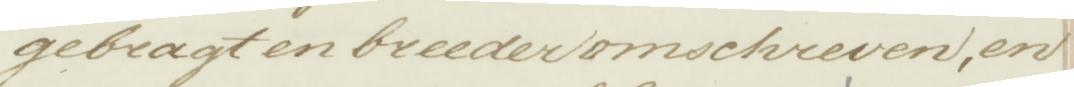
gebragt en breeder omschreven, en
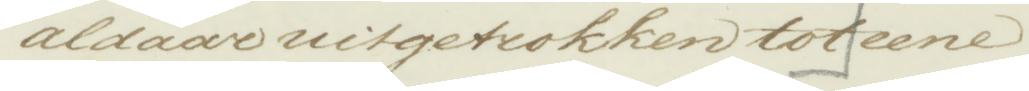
aldaar uitgetrokken tot eene
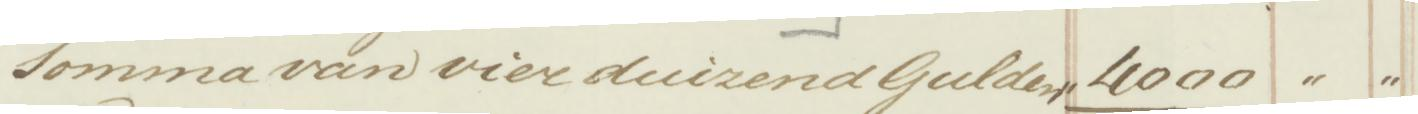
somma van vier duizend Gulden„ 4000 „ „
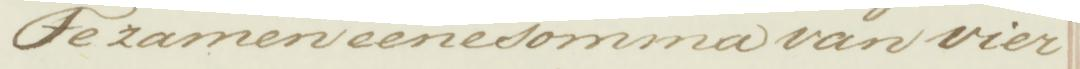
Te zamen eene somma van vier
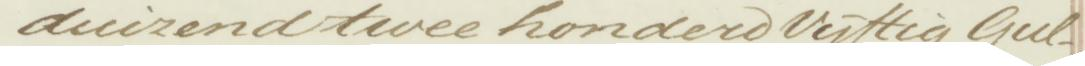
duizend twee honderd Vijftig Gul
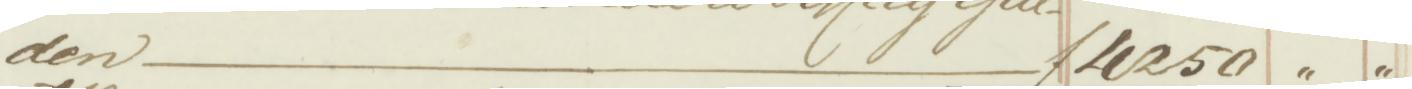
den ƒ4250 „ „
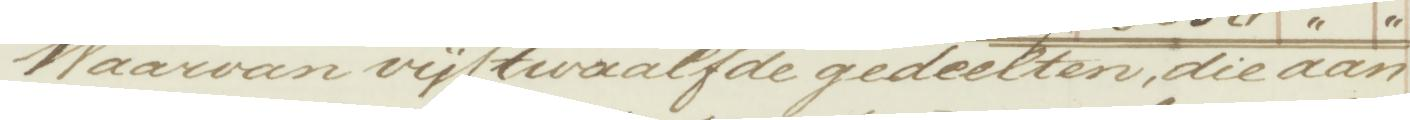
Waarvan vijf twaalfde gedeelten, die aan
